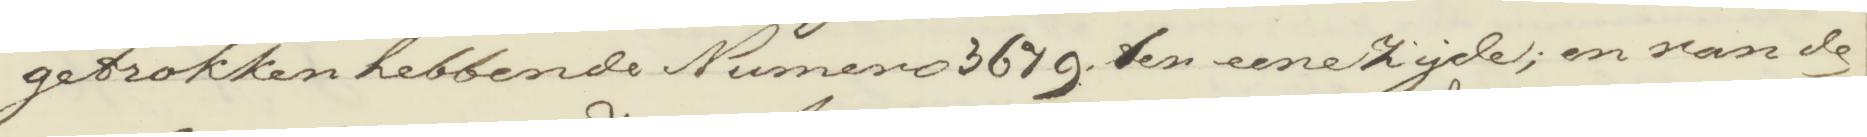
getrokken hebbende Numero 3679, ter eene zijde; en van den
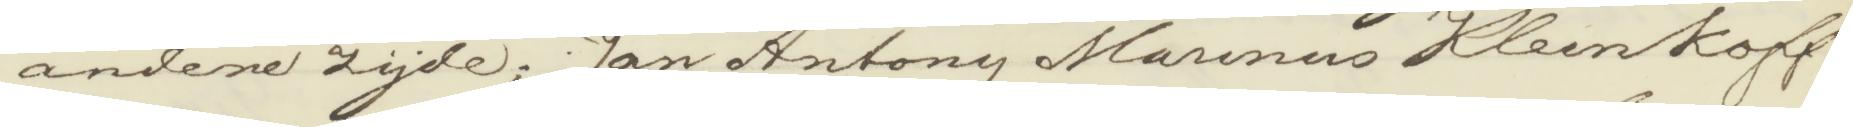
andere zijde; Jan Antony Marinus Kleinkoff,
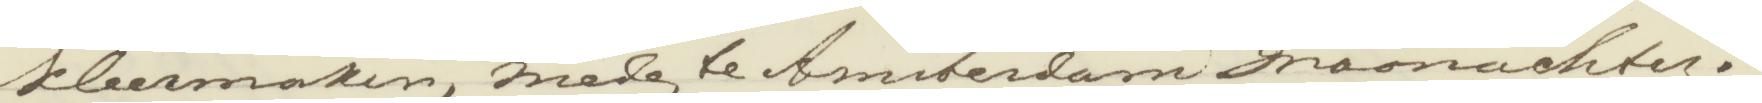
kleermaker, meden te Amsterdam woonachtig.
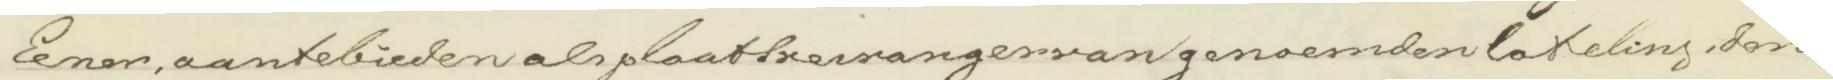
Eener, aantebieden als plaatsvervanger van genoemden loteling, den
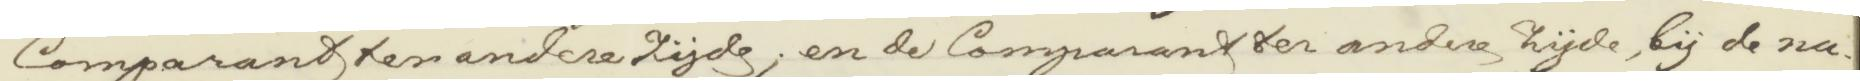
Comparant ter andere zijden; en de Comparant ter anderen zijde, bij de na.
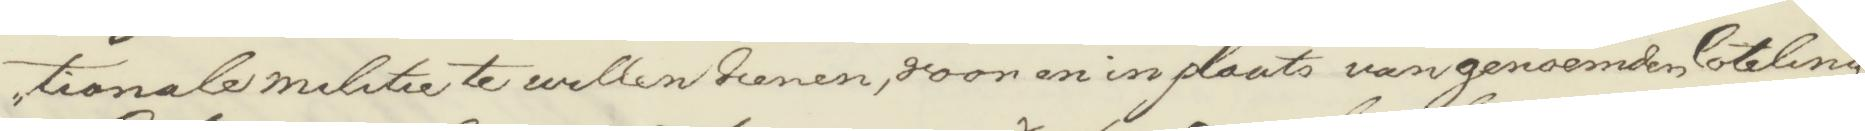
„tionale militie te willen dienen, voor en in plaats van genoemden loteling
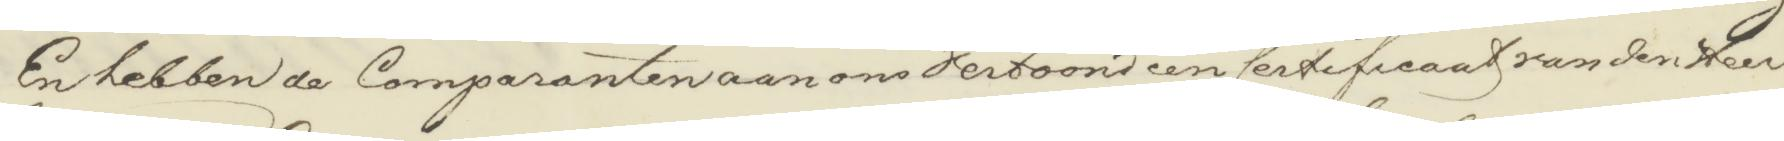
En hebben de Comparanten aan ons vertoond een Certificaat van den Heer
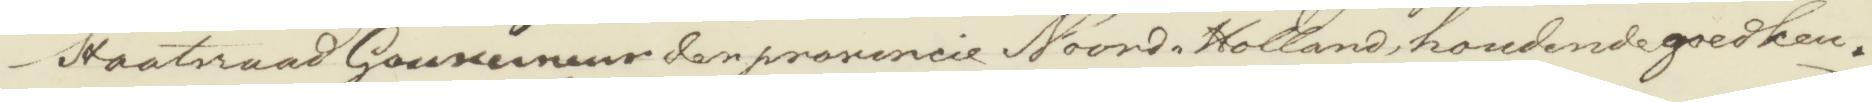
Staatsraad Gouverneur der provincie Noord„Holland, houdende goedkeu„
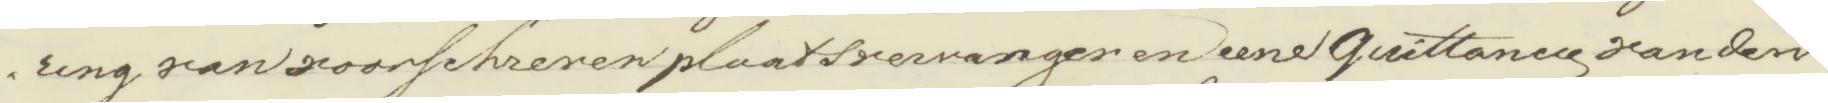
„ring van voorschreven plaatsvervanger en eene quittancie van den
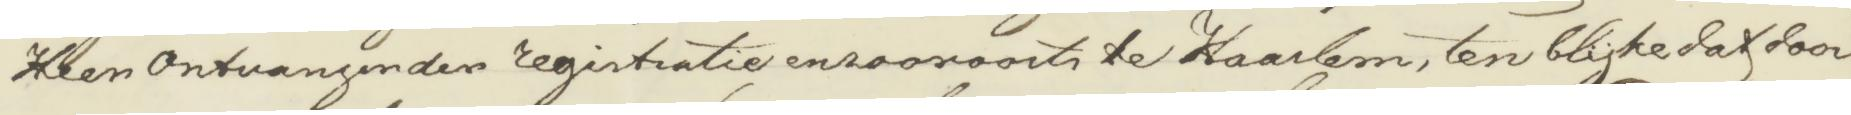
Heer Ontvanger der registiatie enzoovoorts te Haarlem, ten blijke dat door
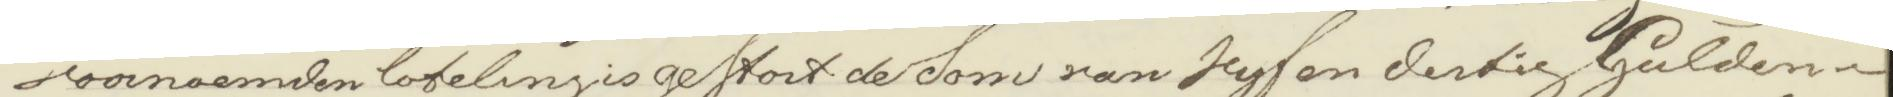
voornoemden loteling is gestort de som van Vyf en dertig Gulden
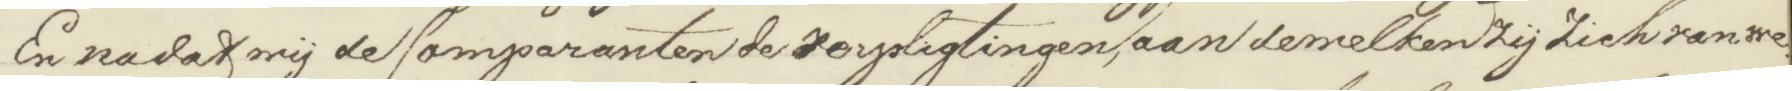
En nadat wij de Comparanten de verpligtingen, aan dewelken zij zich van we.
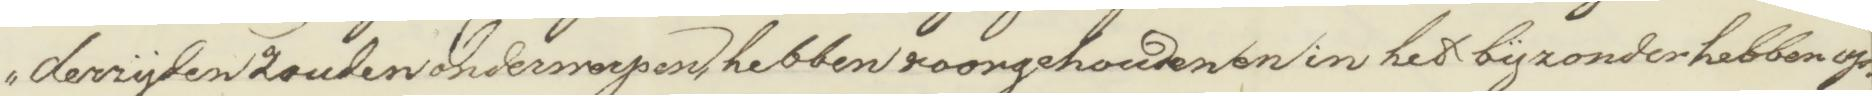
„derzijden zouden onderwerpen, hebben voorgehouden en in het bij zonder hebben op.
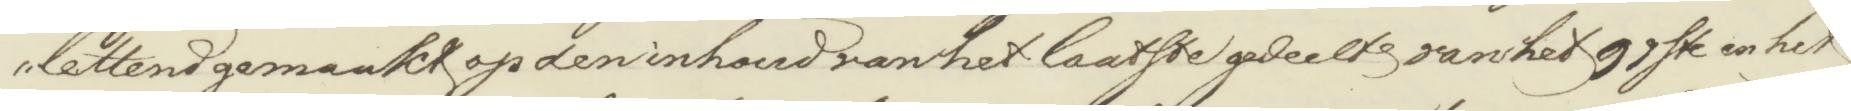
„lettend gemaakt op den inhoud van het laatste gedeelte van het 97ste en het
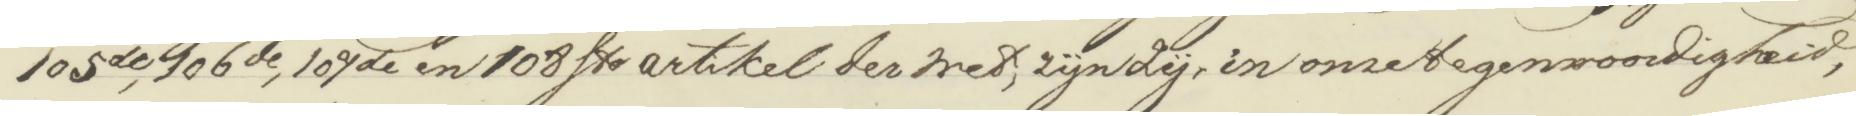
105de, 106de, 107de en 108ste artikel der wet, zijn zij, in onze tegenwoordigheid,
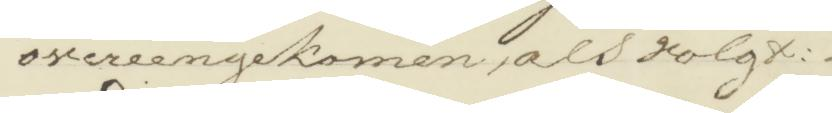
overeengekomen, als volgt:
